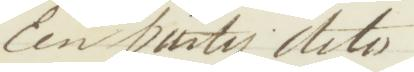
Een partij dito
